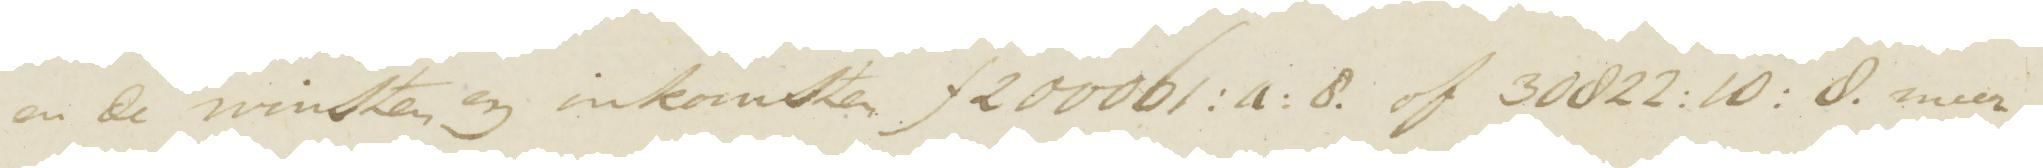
en de winsten en inkomsten ƒ 200061: 4: 8. of 30822: 10: 8. meer
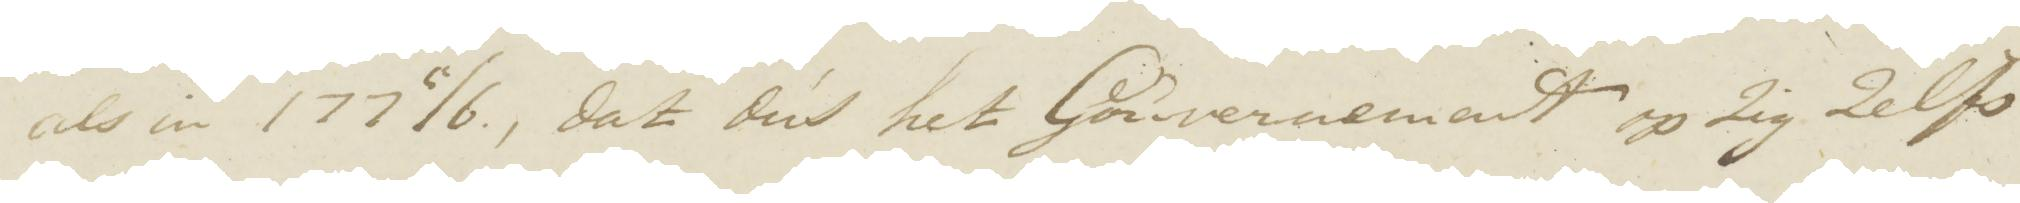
als in 177 5/6., dat dus het Gouvernement op zig zelfs
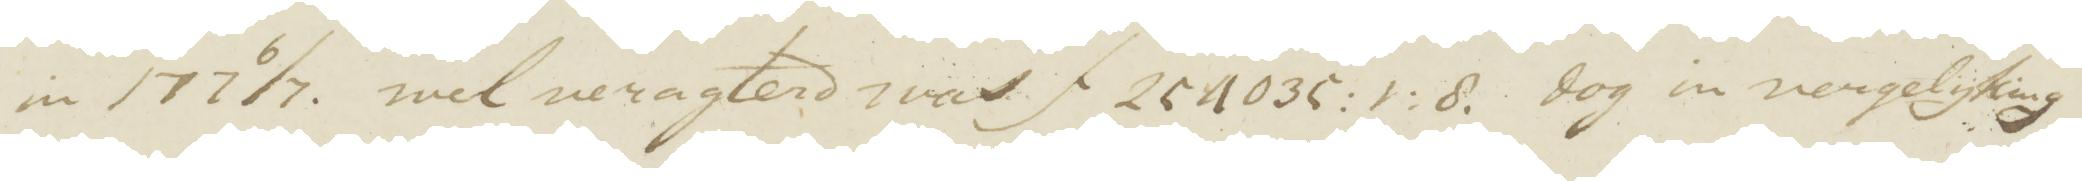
in 177 6/7. wel veragterd was ƒ 254035: 1: 8. dog in vergelijking
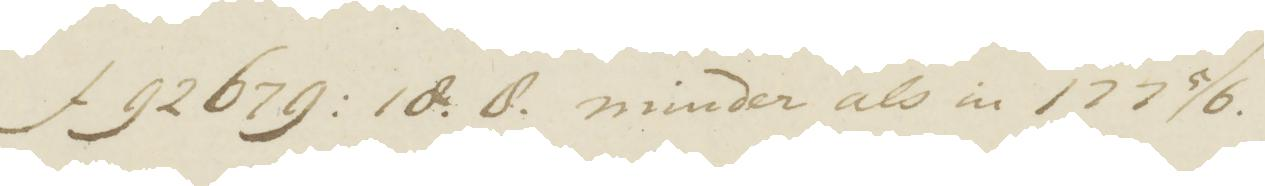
ƒ 92679: 18: 8. minder als in 177 5/6.
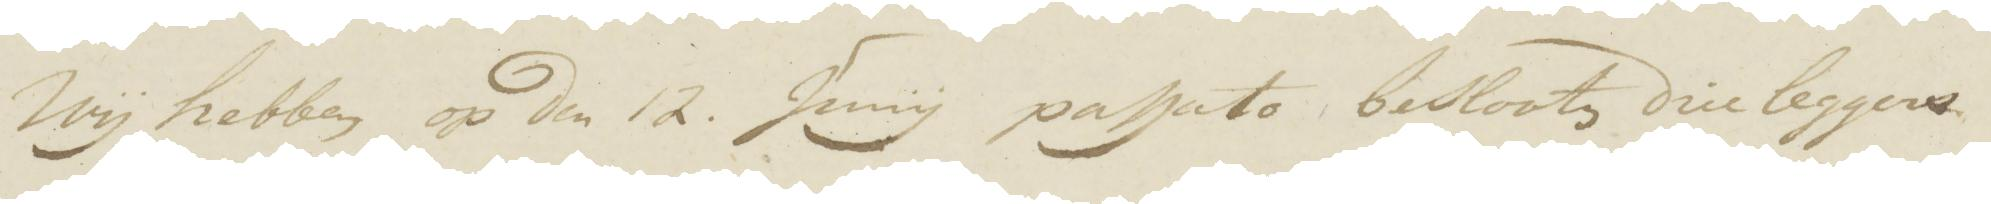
wij hebben op den 12. Junij passato beslooten drie leggers
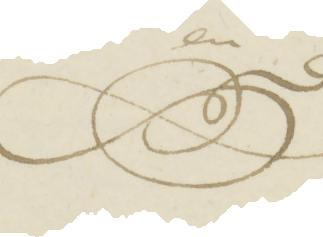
en H
